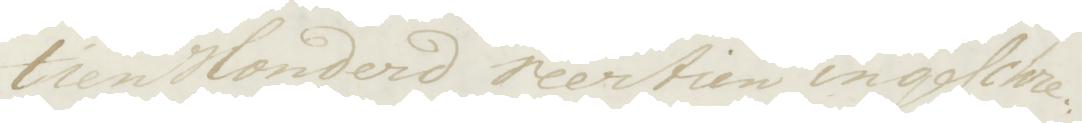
tien Honderd veertien ingeschre„
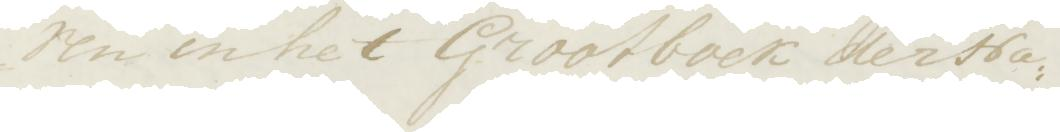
„ven in het Grootboek der Na„
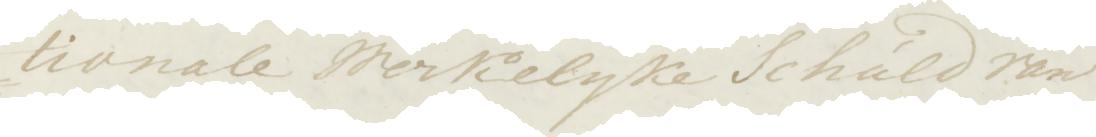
„tionale Werkelyke schuld van
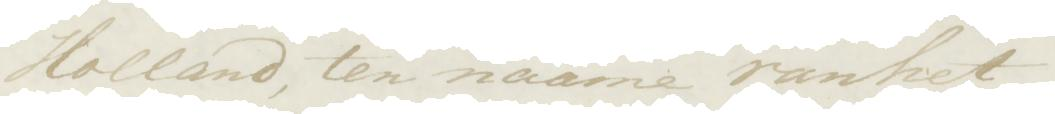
Holland, ten naame van het
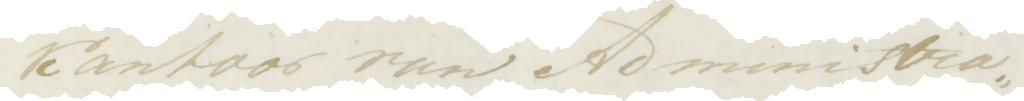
Kantoor van Administra„
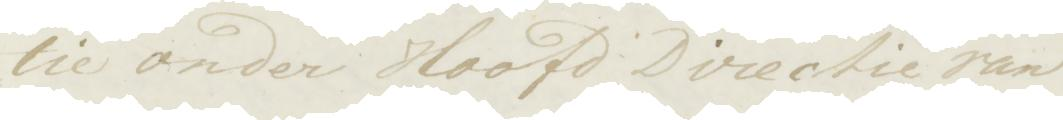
tie onder Hoofd Directie van
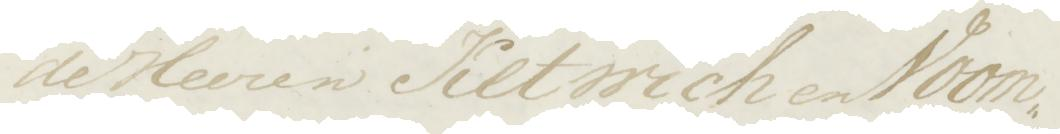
de Heeren Ketwich en Voom„
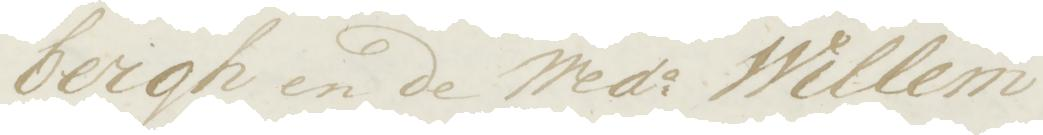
bergh en de wed.e Willem
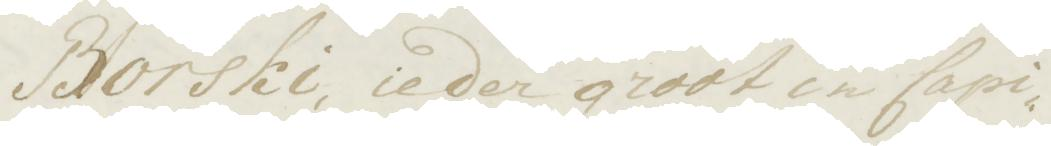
Borski, ieder groot in capi„
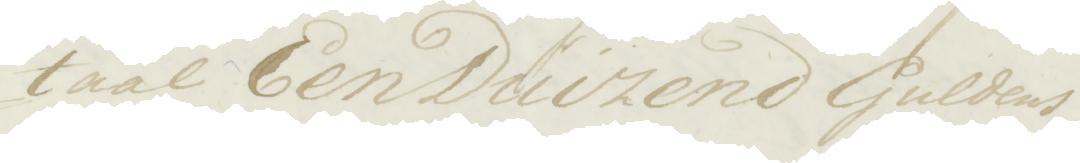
„taal Een Duizend Guldens
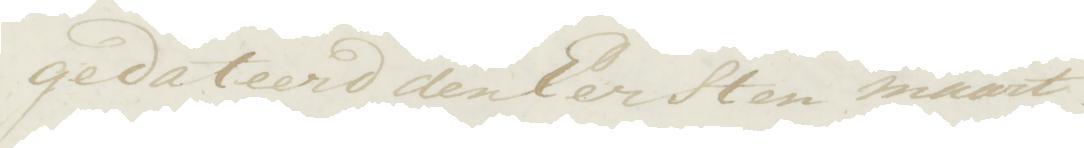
gedateerd den Eersten maart
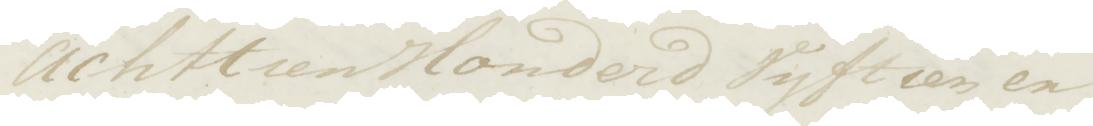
achttien Honderd Vijftien en
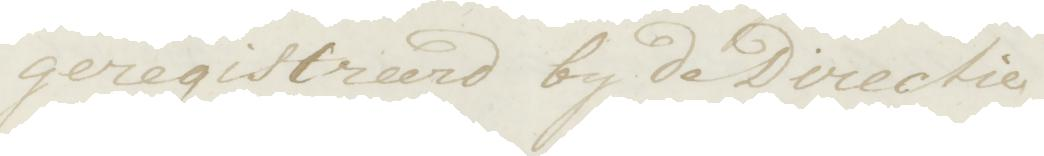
geregistreerd by de Directie
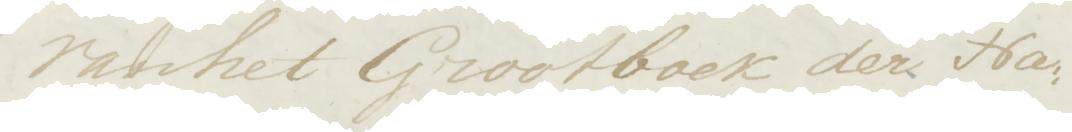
van het Grootboek der Na„
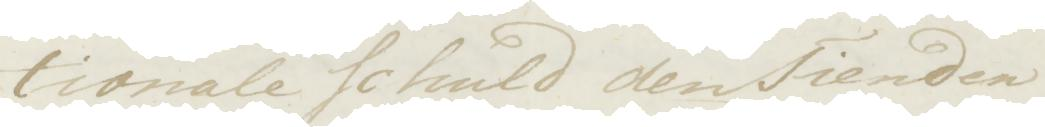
tionale schuld den Tienden
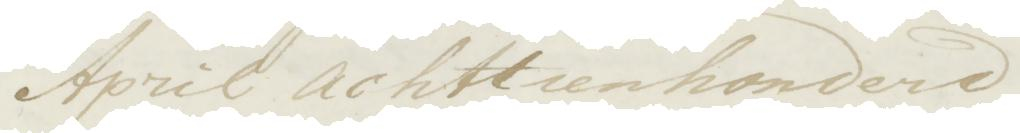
April achttienhonderd
